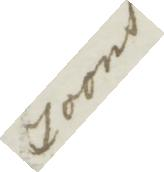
zoons
